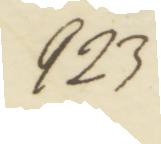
923
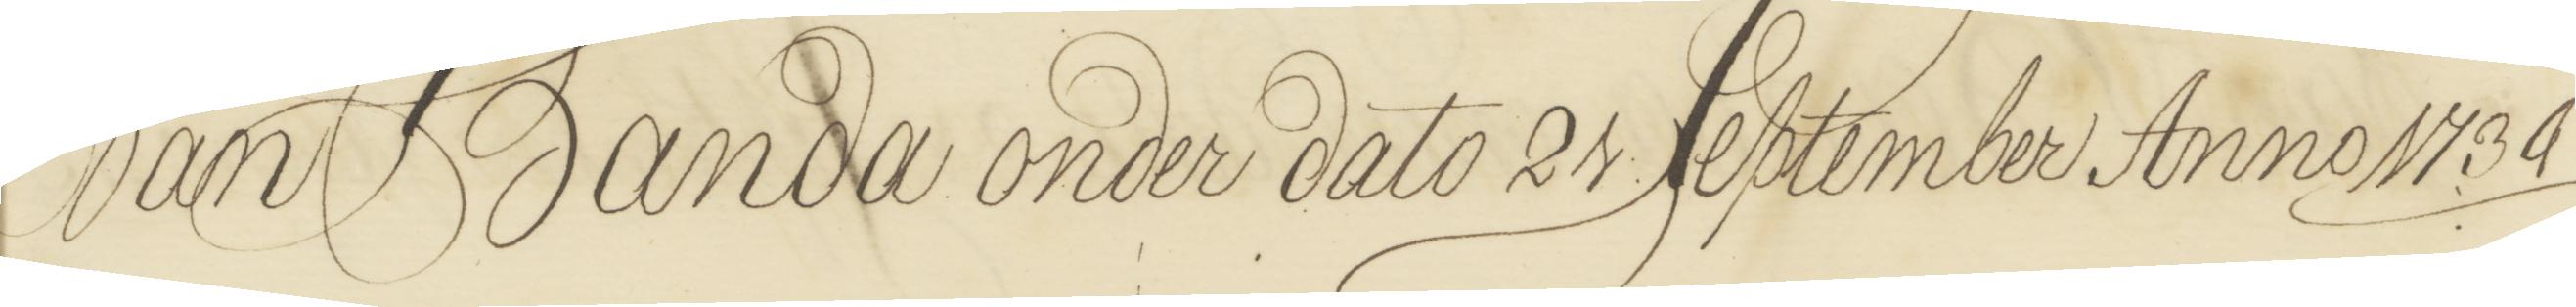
Van Banda onder dato 21: September Anno 1734.
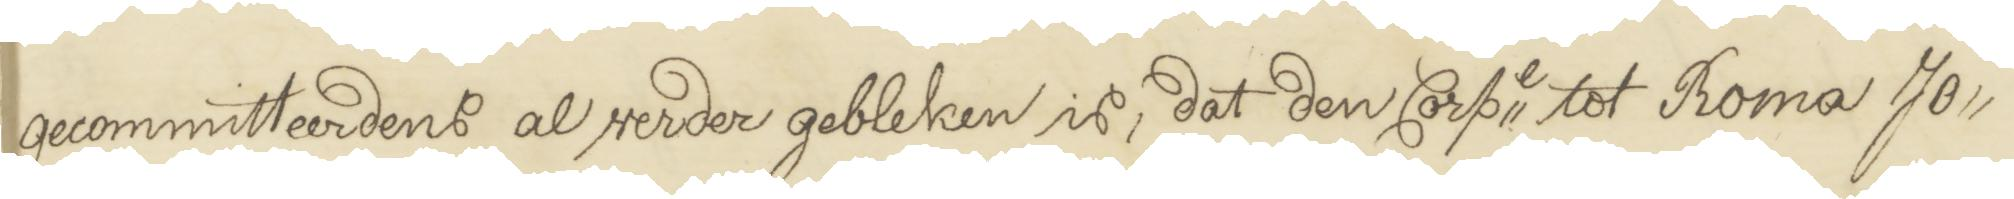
gecommitteerdens al verder gebleken is, dat den Corp„l tot Roma Jo„
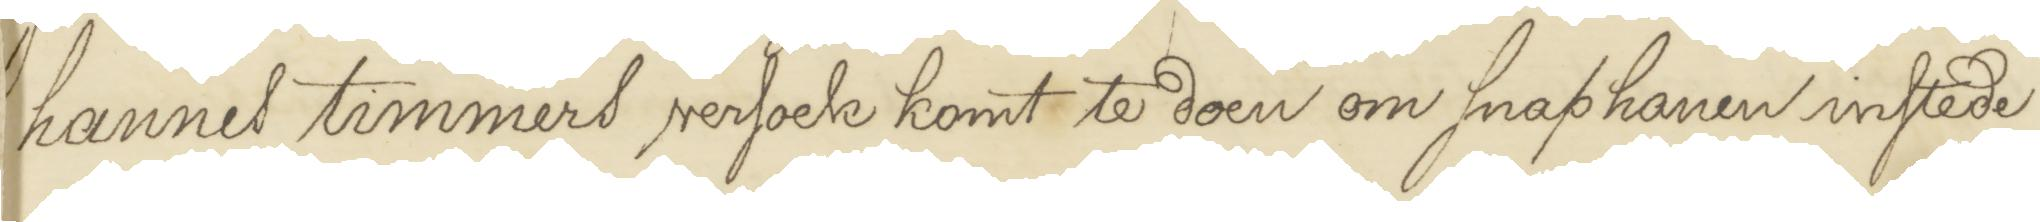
hannes timmers versoek komt te doen om Snaphanen instede
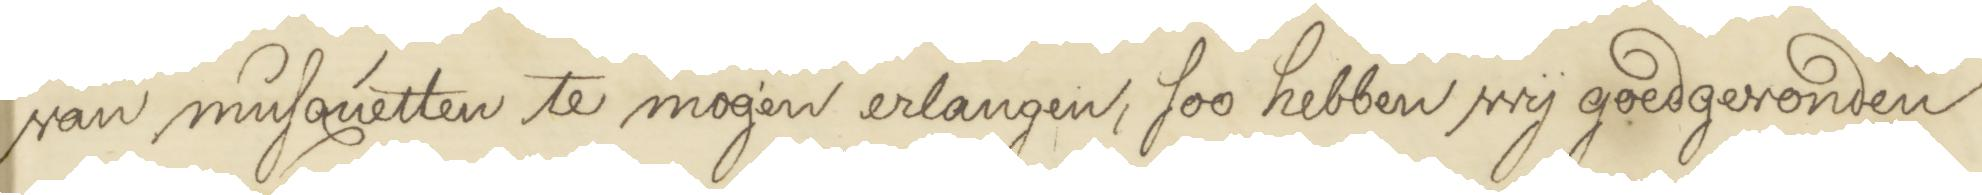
van musquetten te mogen erlangen, Soo hebben wij goedgevonden
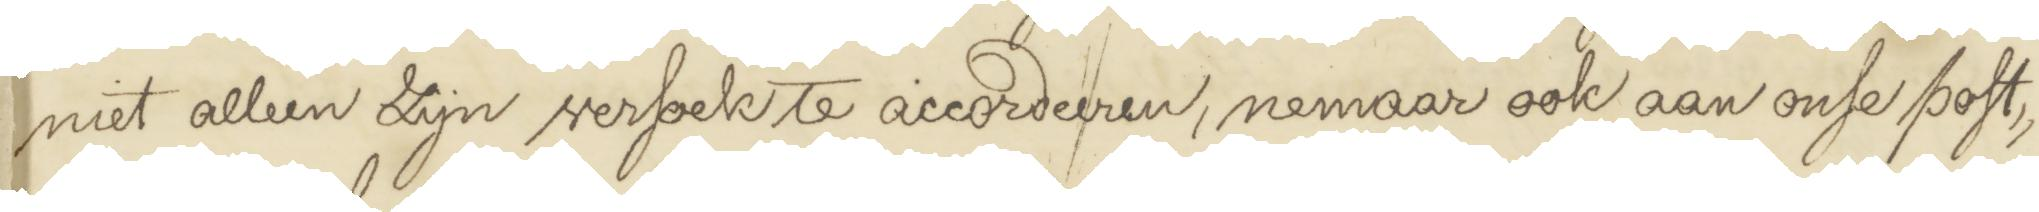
niet alleen Zijn versoek te accordeeren, nemaar ook aan onse post„
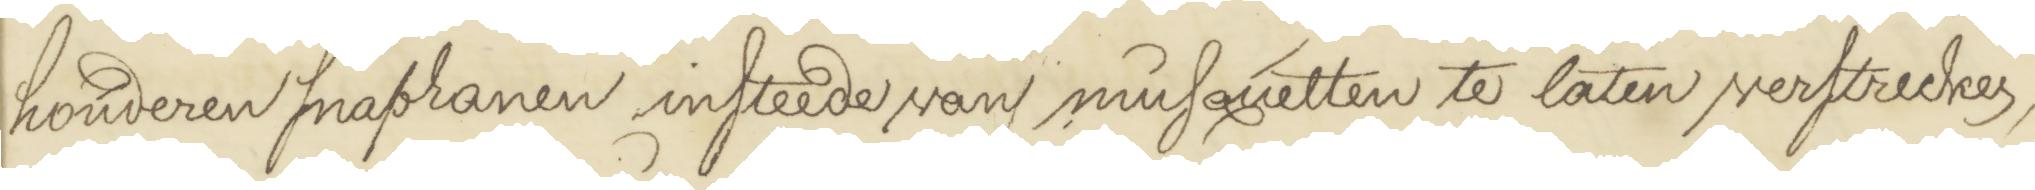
houderen Snaphanen insteede van musquetten te laten verstrecken,
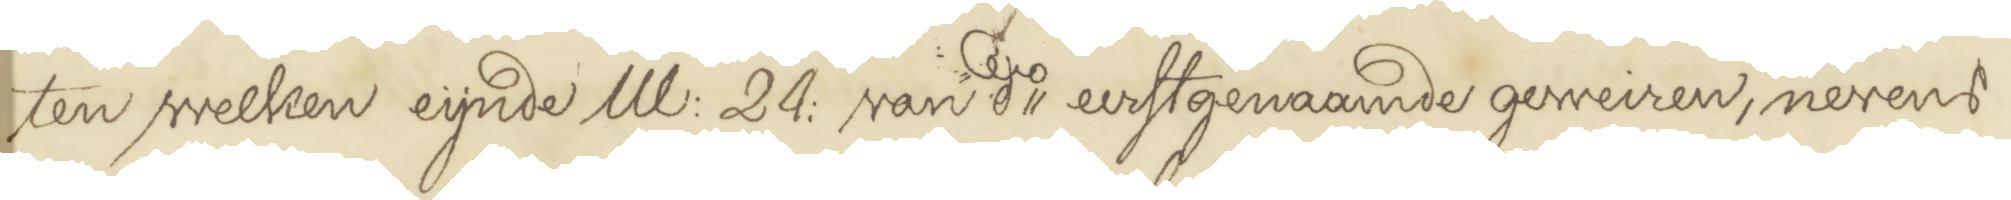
ten welken eijnde Ul: 24: van d„o eerstgenaamde geweiren, nevens
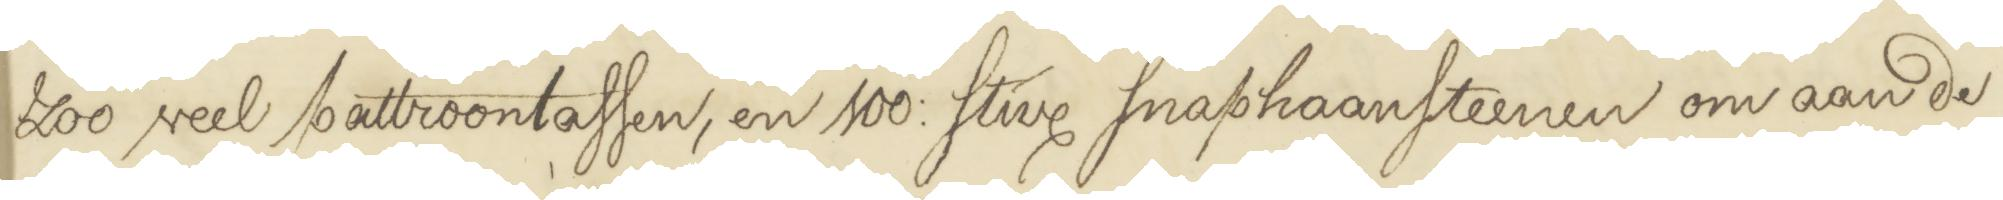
Zoo veel pattroontassen, en 100: stux snaphaansteenen om aan de
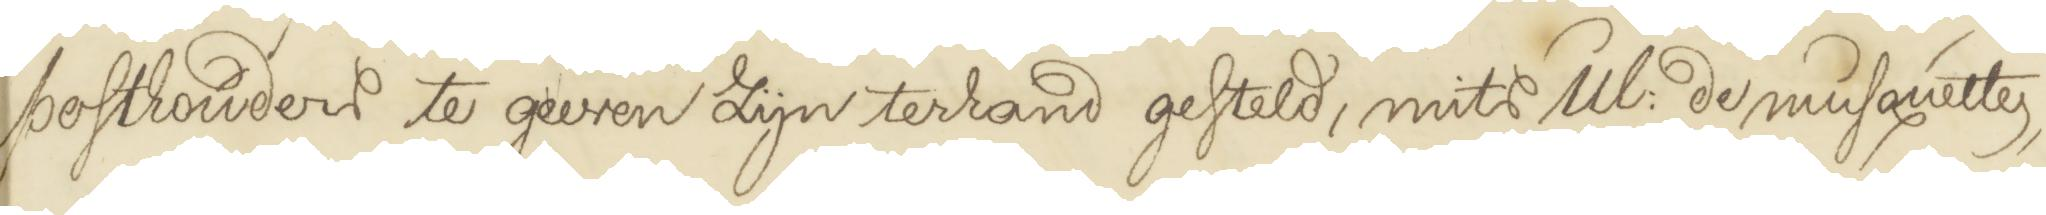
posthouders te geeven Zijn terhand gesteld, mits Ul: de musquetten,
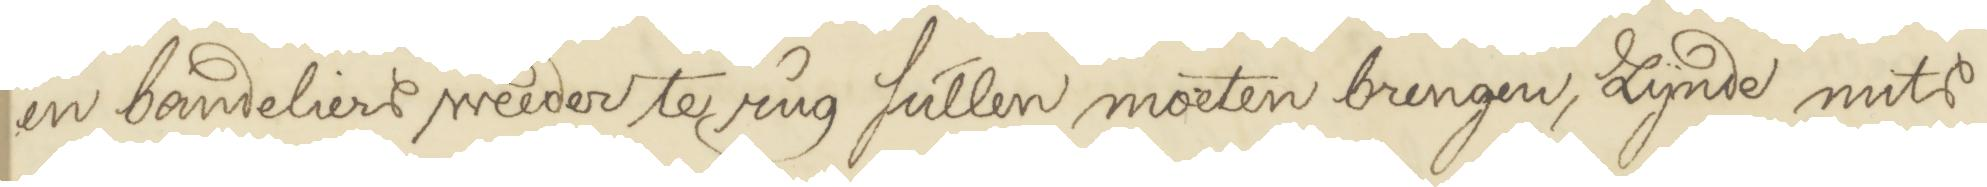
en bandeliers weeder terug sullen moeten brengen, Zijnde mits
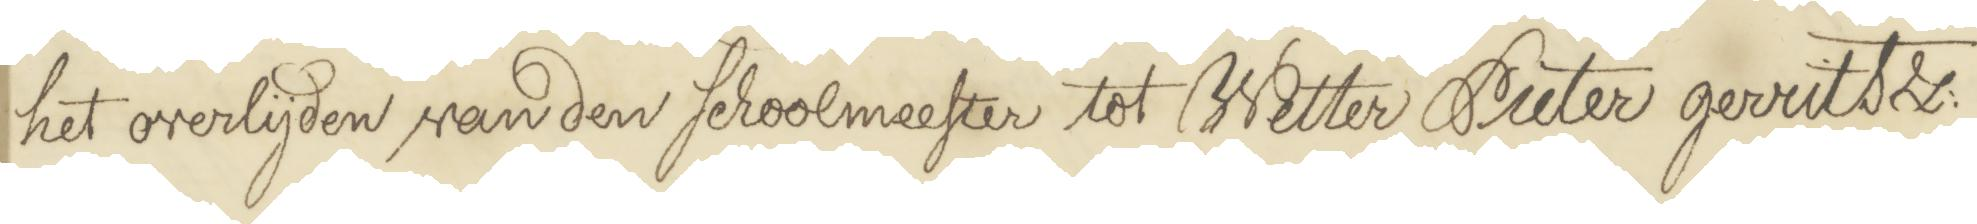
het overlijden van den schoolmeester tot Wetter Pieter gerritsz:
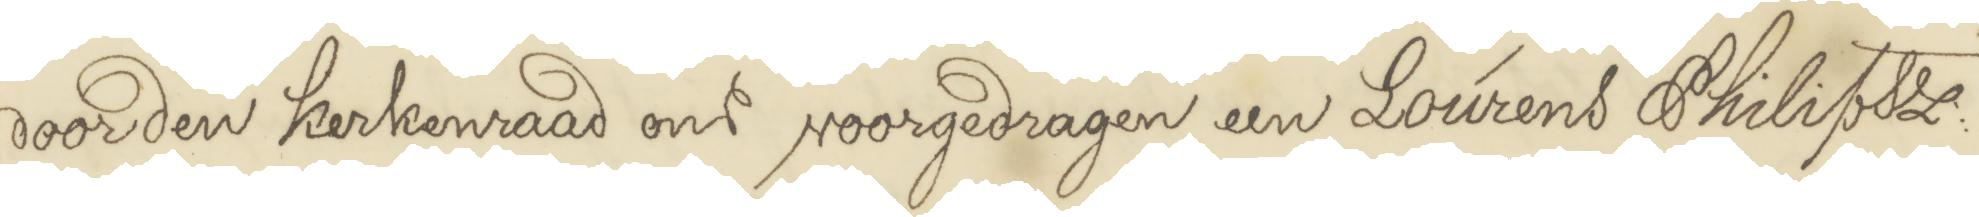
door den kerkenraad ons voorgedragen een Lourens Philipsz:
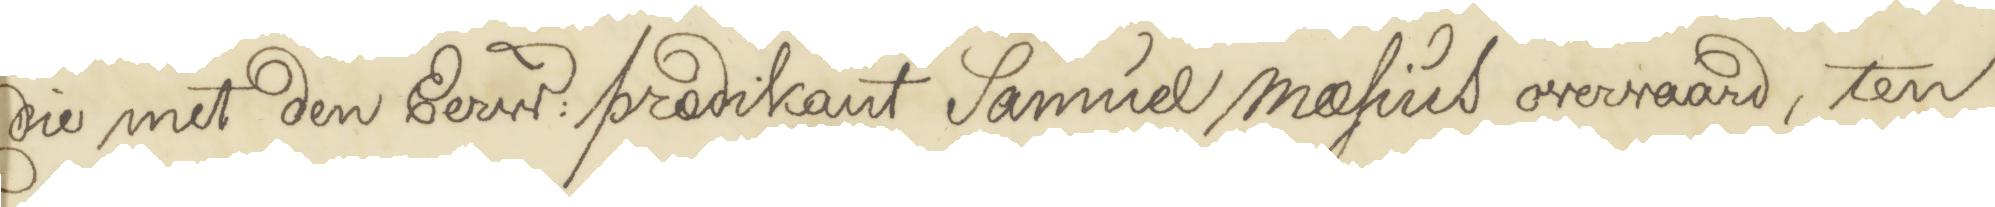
die met den Eerw: predikant Samuel meesius overvaard, ten
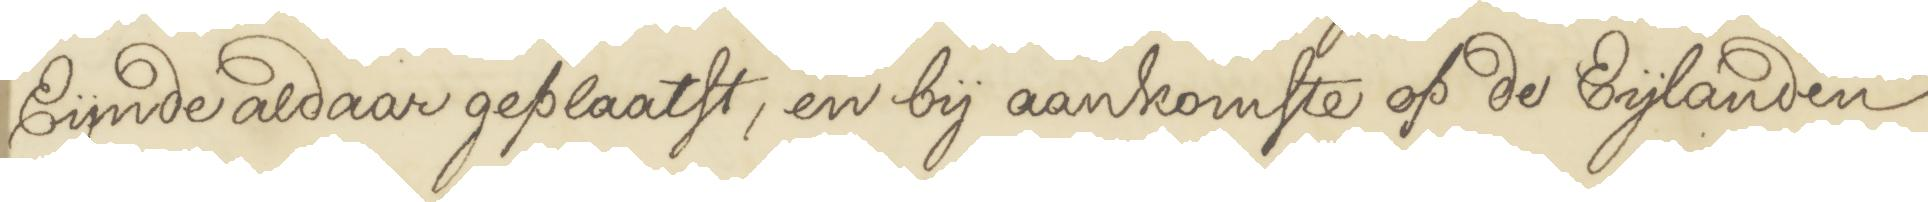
Eijnde aldaar geplaatst, en bij aankomste op de Eijlanden
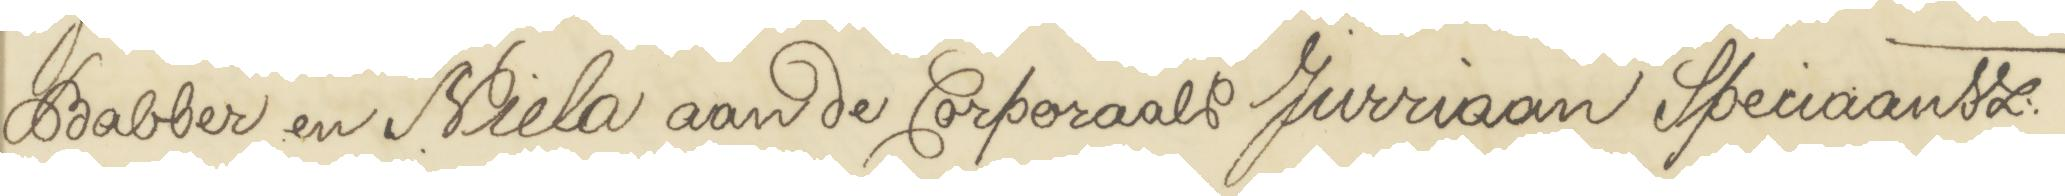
Babber en Niela aan de Corporaals Jurriaan Speciaansz:
